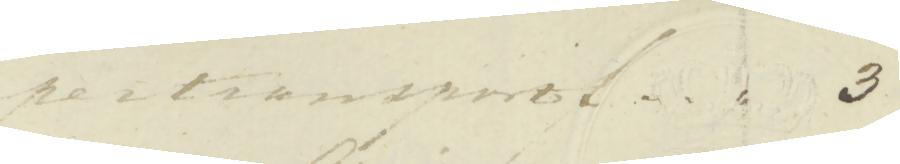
per transport - . „ 3
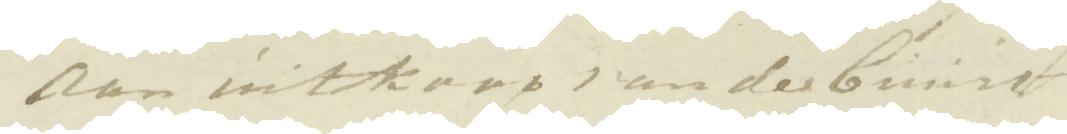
aan uitkoop van de buurt
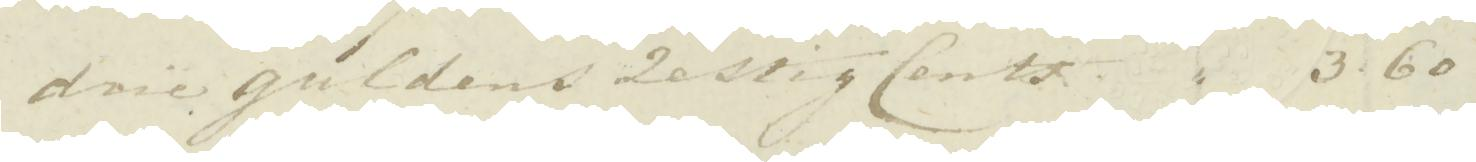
drie guldens zestig Cents. „ 3.60
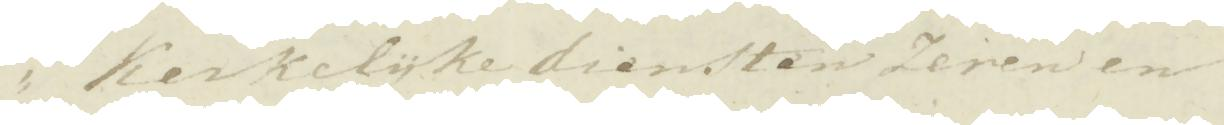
„kerkelijke diensten Zeven en
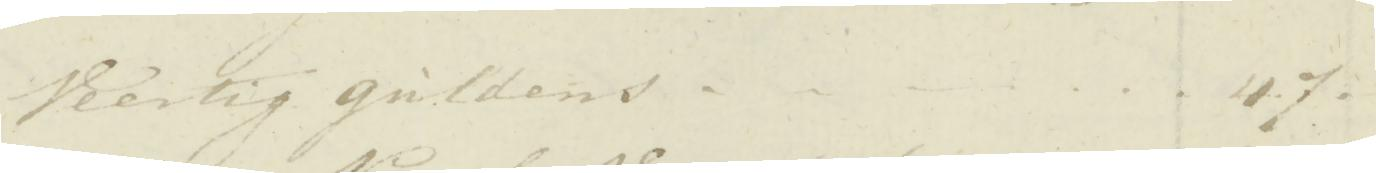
Veertig guldens - - - . . . . 47.
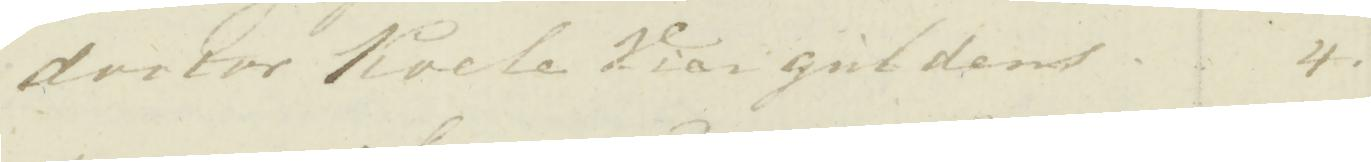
doctor Koele Vier guldens . . 4.
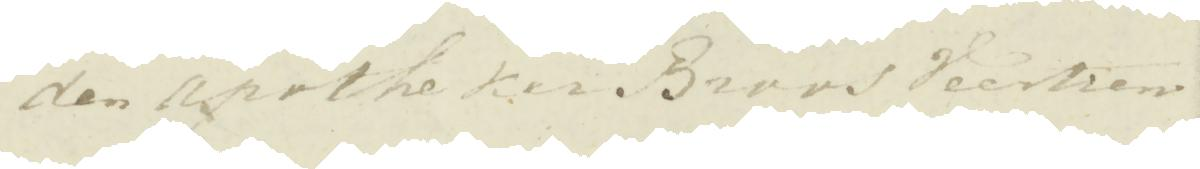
den apotheker Broos Veertien
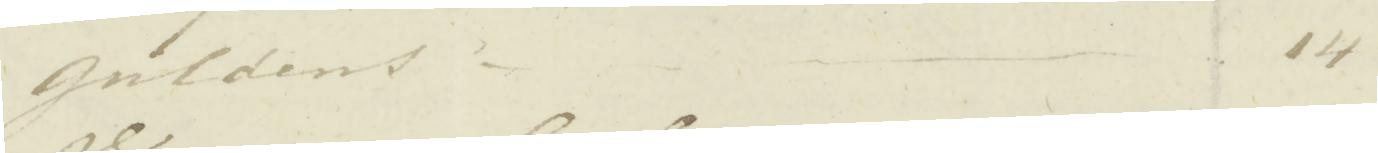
guldens '—14
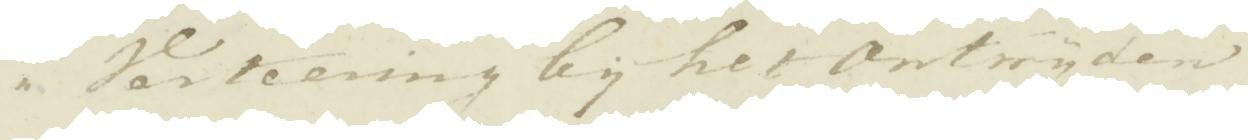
„ Verteering bij het Ontwijden
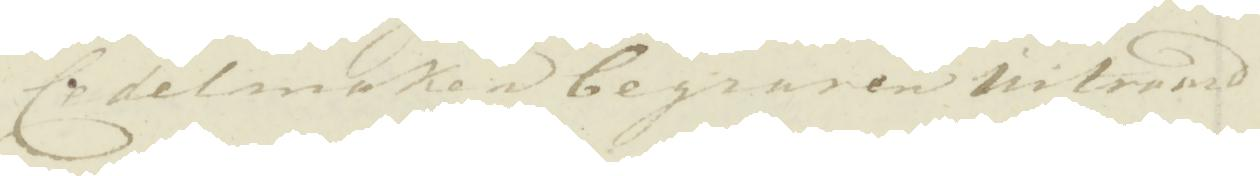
Cedelmaken begraven uitvaard
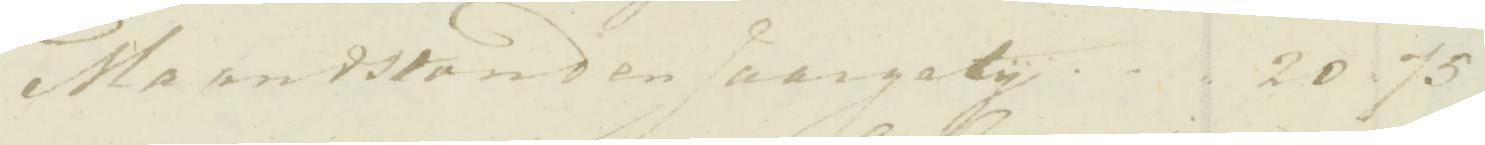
Maandstand en Jaargetij 20. 75
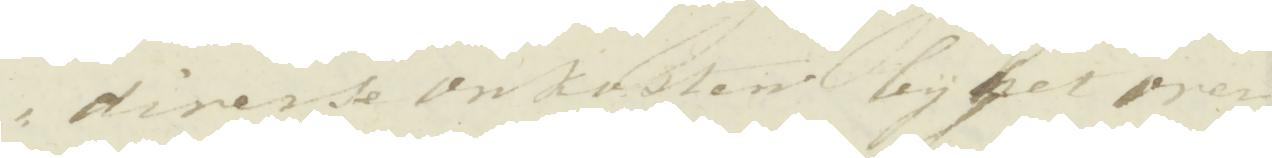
„ diverse onkosten bij het over
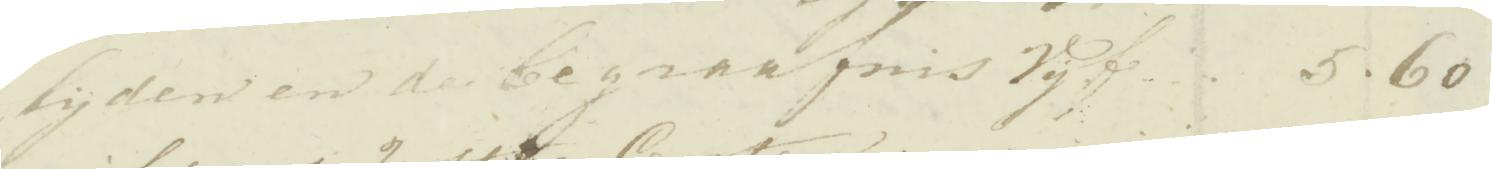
„lijden en de begraafnis Vijf . . . 5.60
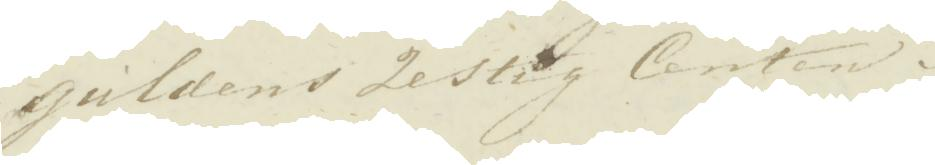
guldens zestig Centen.
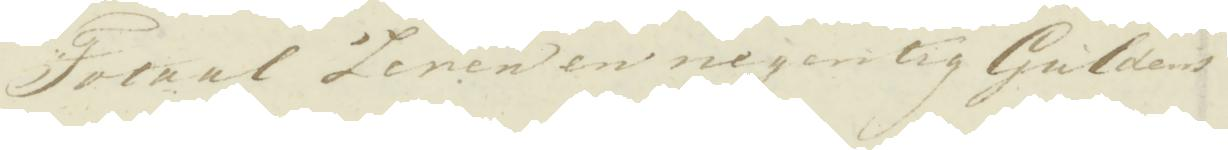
Totaal Zeven en negentig Guldens
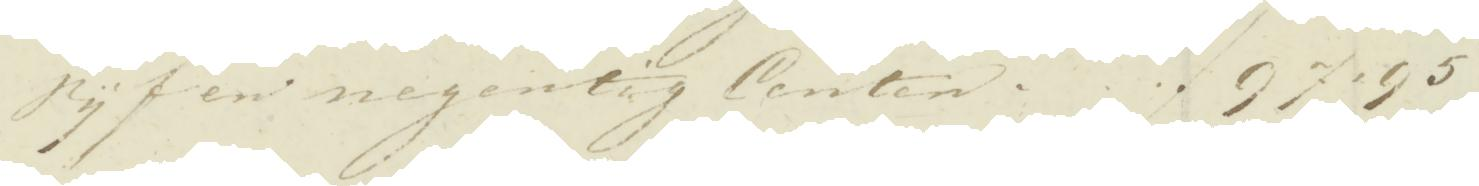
vijfen negentig Centen . . . . ƒ 97.95
